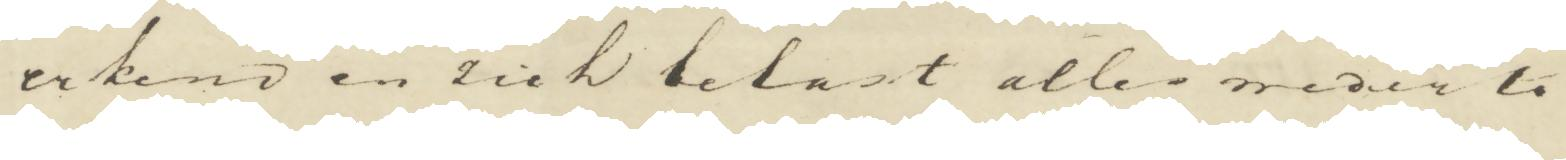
erkend en zich belast alles weder te
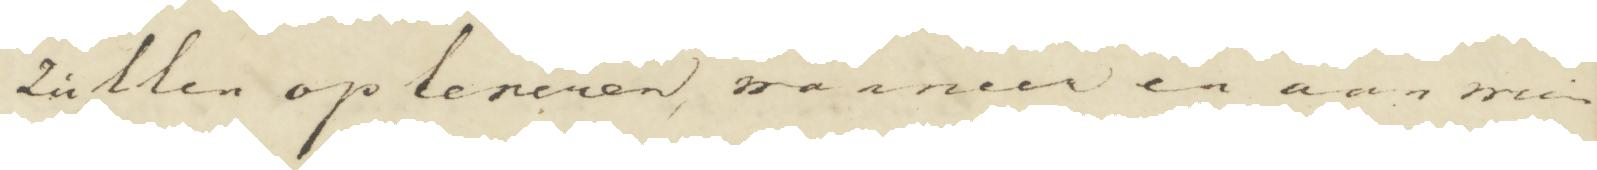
zullen op leveren, wanneer en aan wie
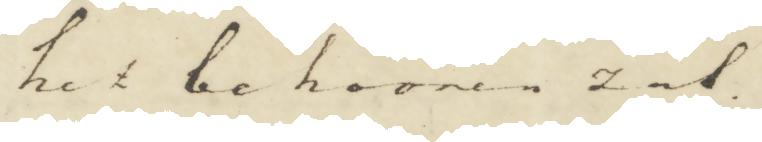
het behooren zal.
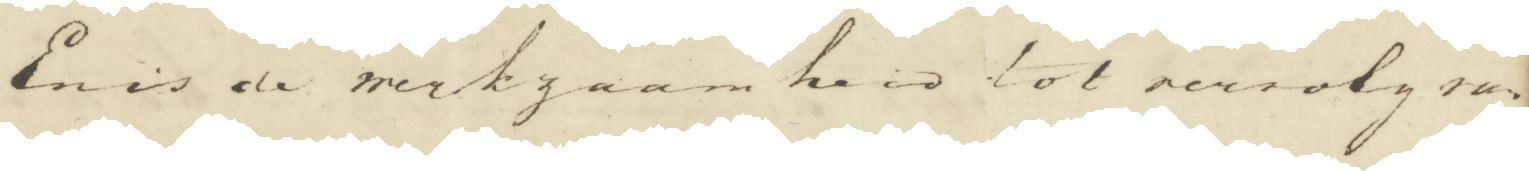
En is de werkzaamheid tot vervolg van
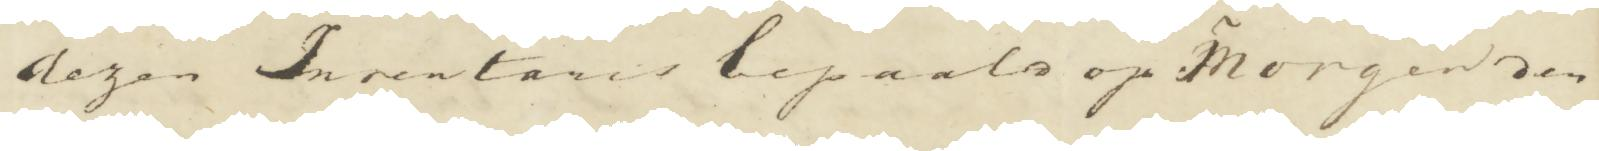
dezen Inventaris bepaald op Morgen den
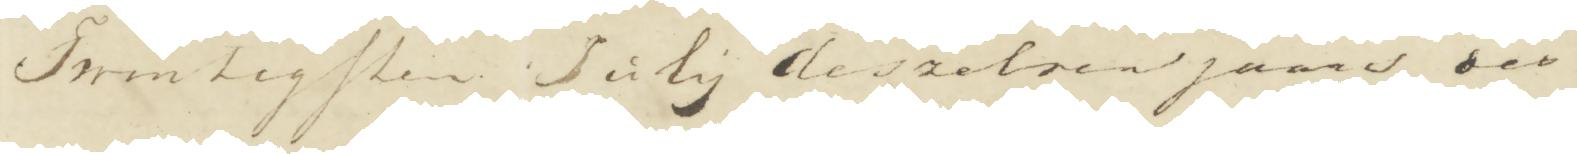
Twintigsten Julij deszelven jaars, des
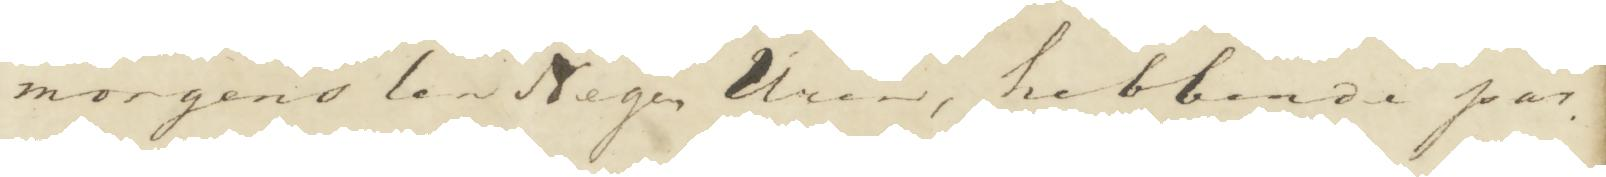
morgens ten Negen Uren, hebbende par„
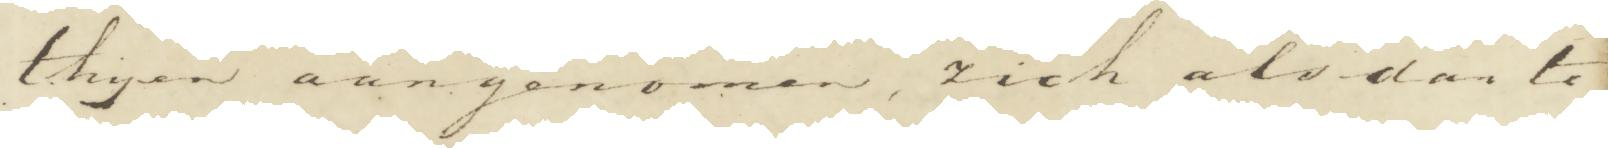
thijen aan genomen, zich als dan te
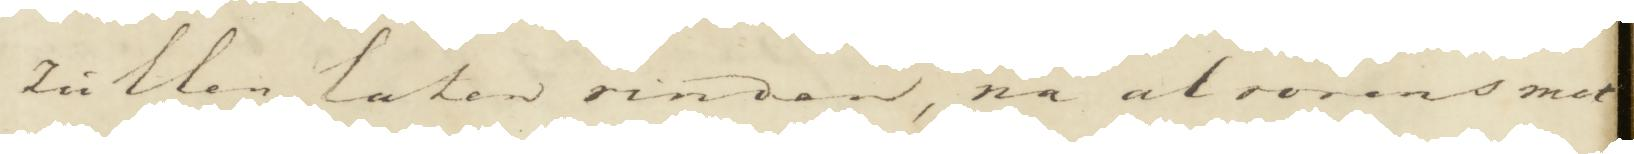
zullen laten vinden, na alvorens met
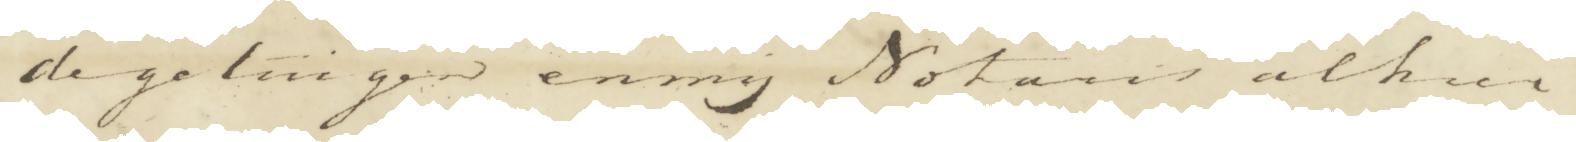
de getuigen en mij Notaris alhier
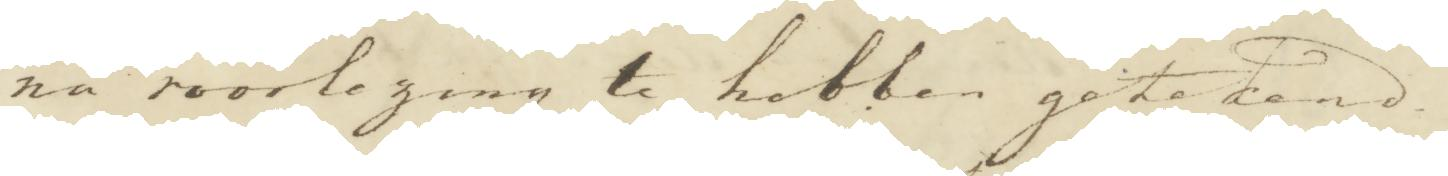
na voorlezing te hebben getekend.
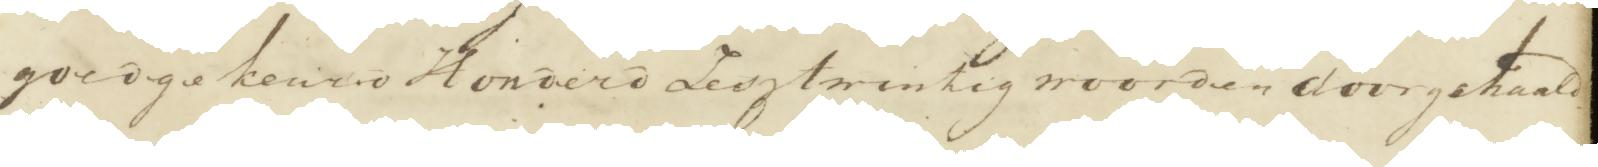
goedgekeurd Honderd zesentwintig woorden door gehaald
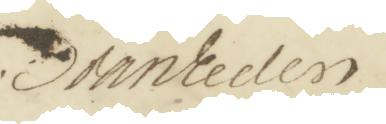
J van Eeden
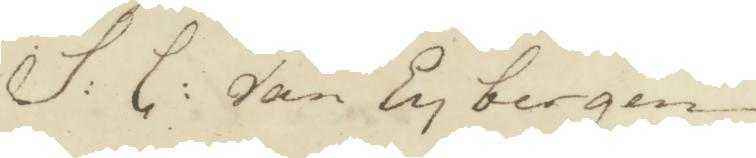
S: G: van Eybergen
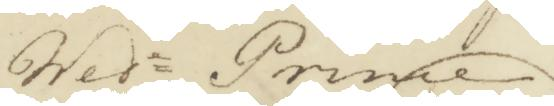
wed=e Prince
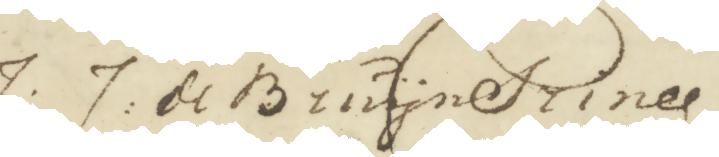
J: de Bruijn Prince
